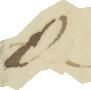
do -
